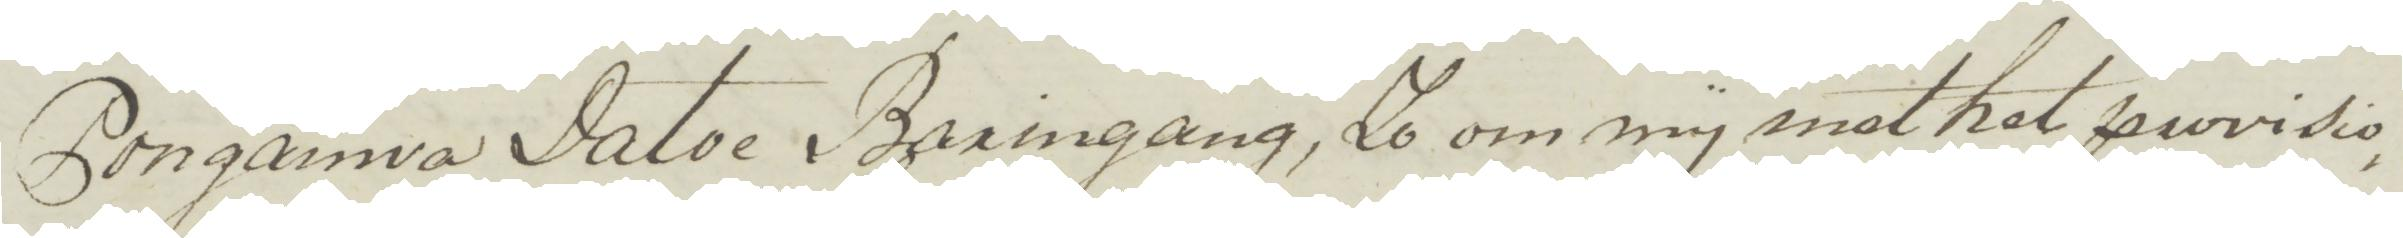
Pongauwa Datoe Baringang, zo om mij met het provisio„
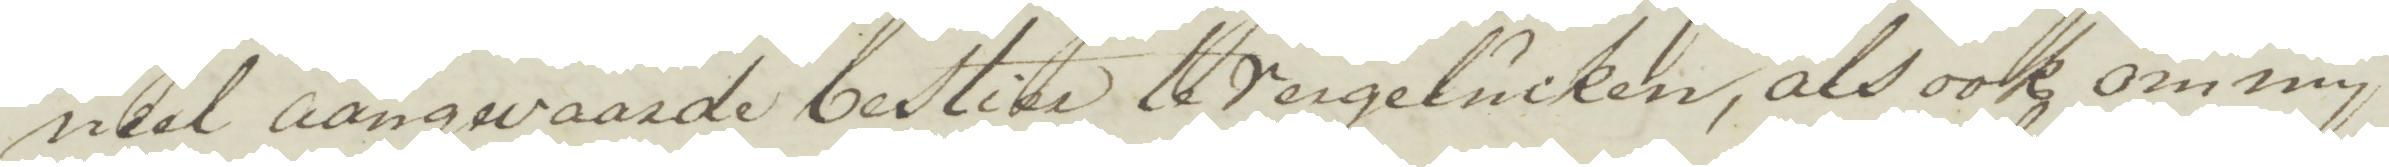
neel aangevaarde bestier te vergelucken, als ook om mij
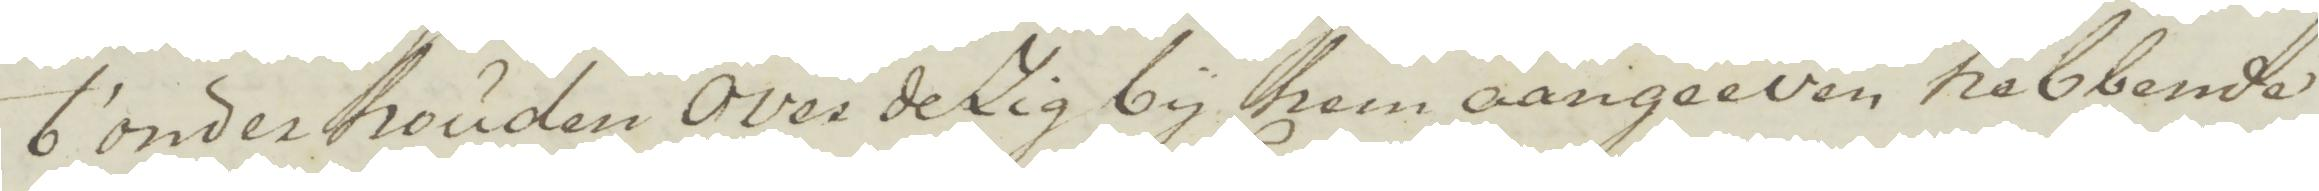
t'onderhouden over de zig bij hem aangeeven hebbende
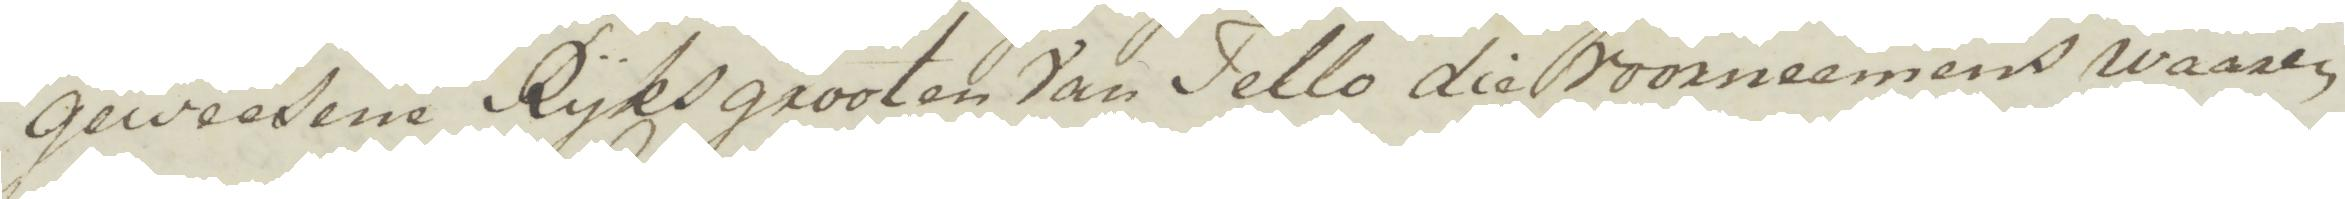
geweesene Rijksgrooten van Tello die voorneemens waaren
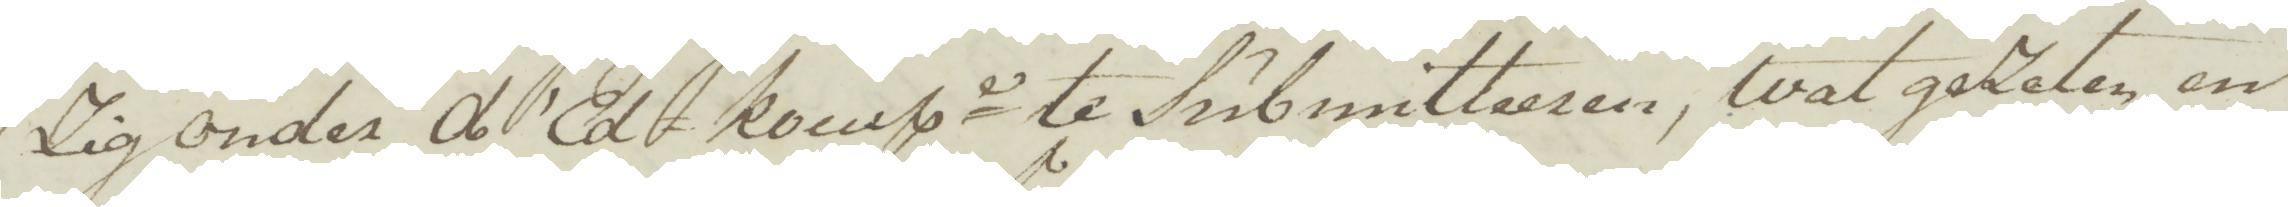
zig onder d' Ed= komp=e te submitteeren, wat gezeten en
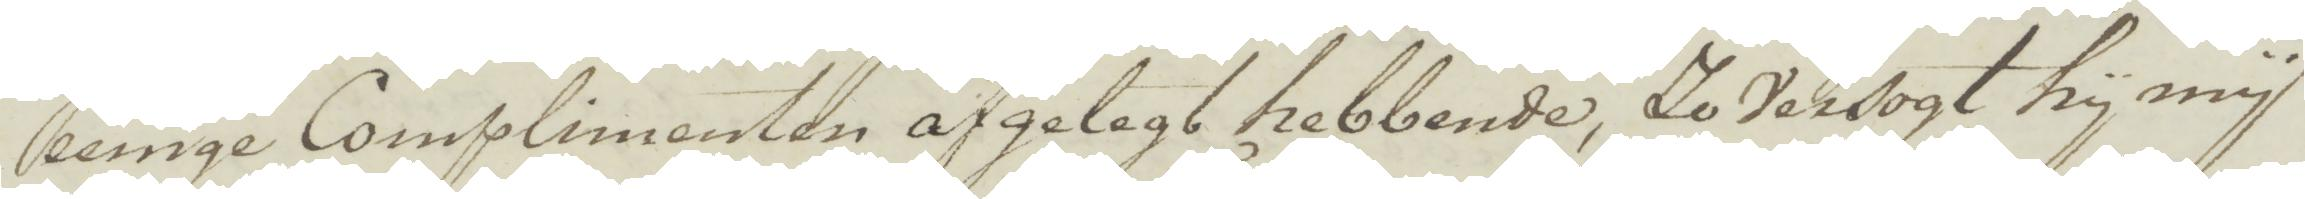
eenige Complimenten afgelegt hebbende, zo versogt hij mij
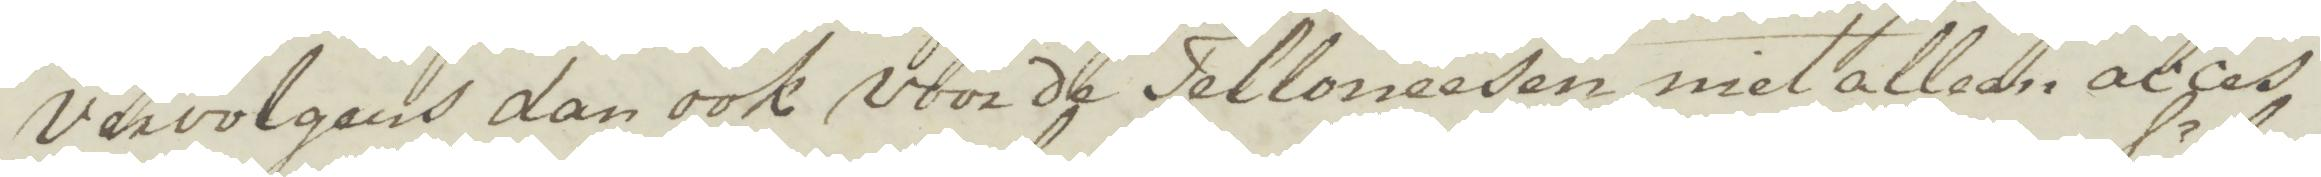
vervolgens dan ook voor de Telloneesen niet alleen acces
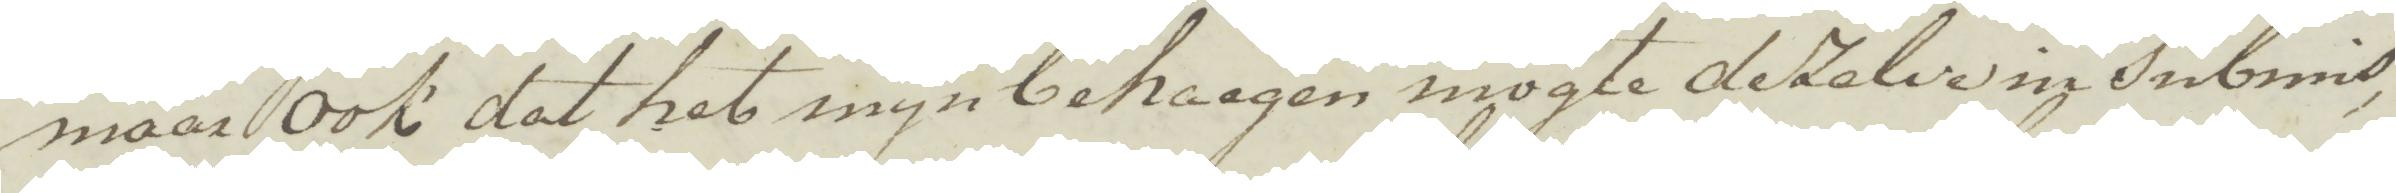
maar ook dat het mijn behaegen mogte dezelve in submis„
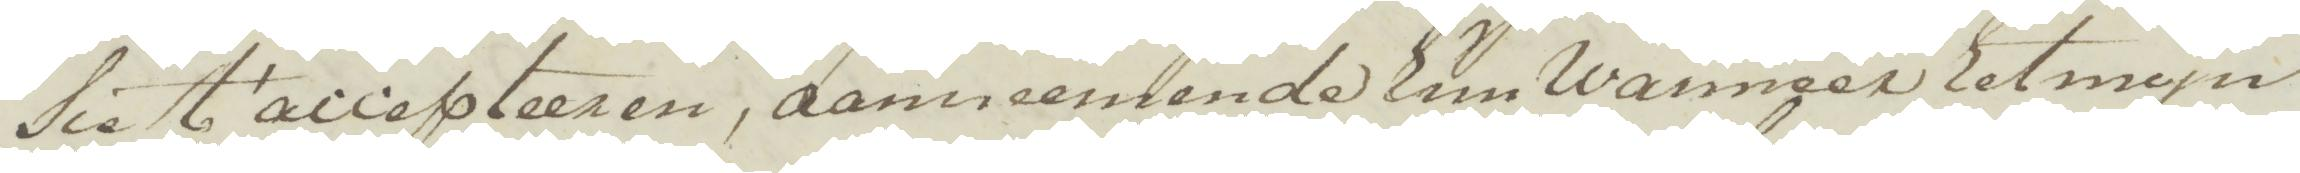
sie t'accepteeren, aanneemende hun wanneer het mijn
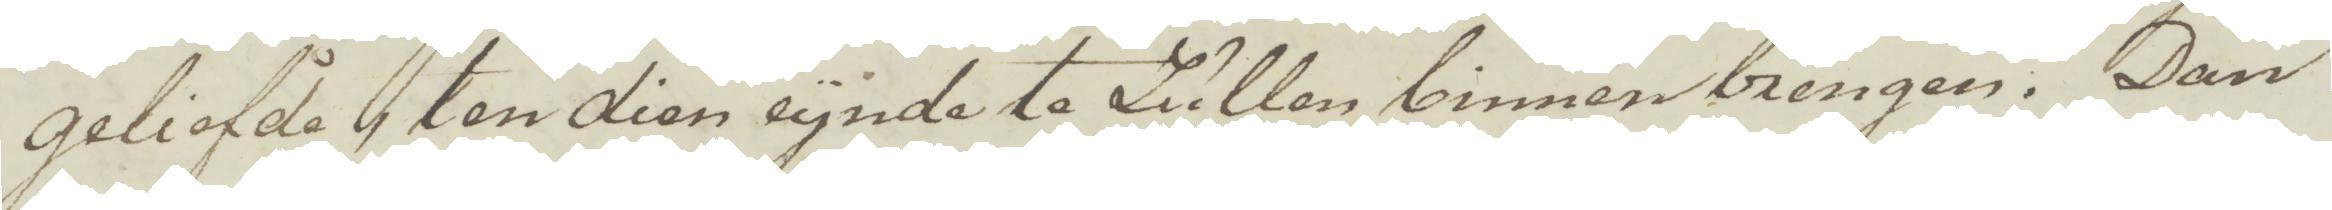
geliefde, ten dien eijnde te zullen binnen brengen. Dan
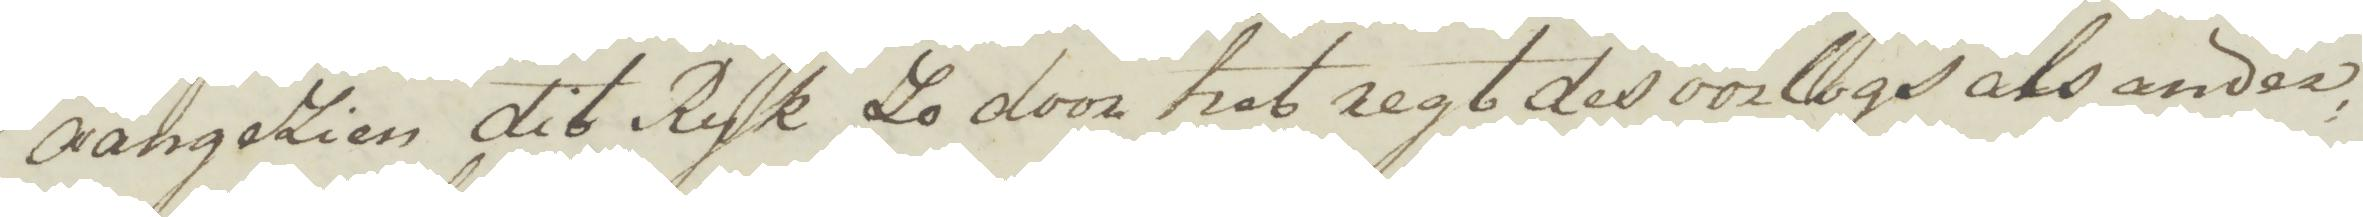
aangezien dit Ryk zo door het regt des oorlogs als ander„
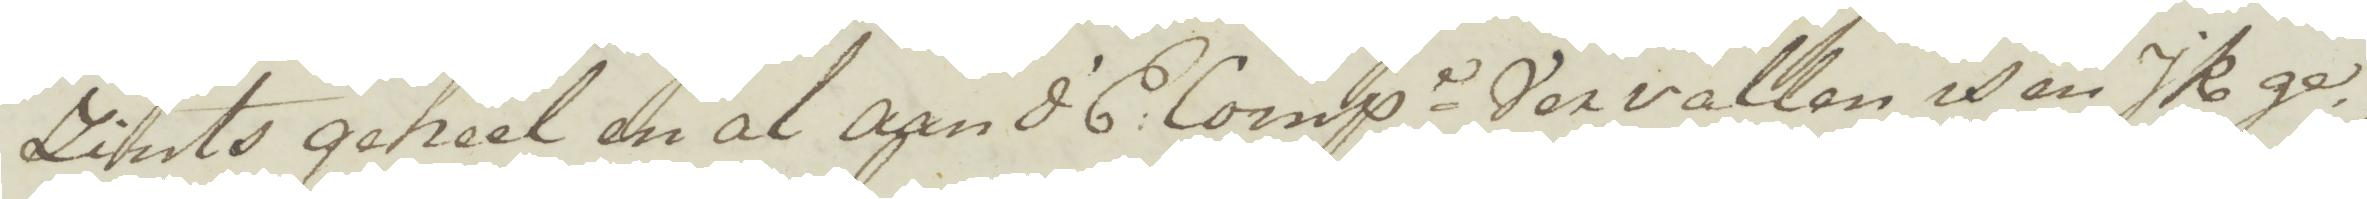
zints geheel en al aan d'E: Comp=e vervallen is en ik ge„
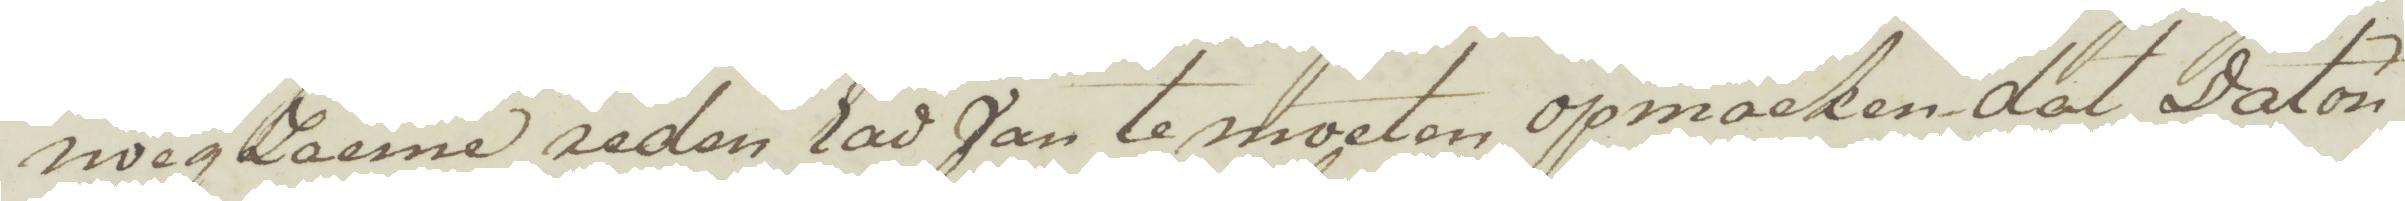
noegzaeme reden had van te moeten opmaeken dat Datou
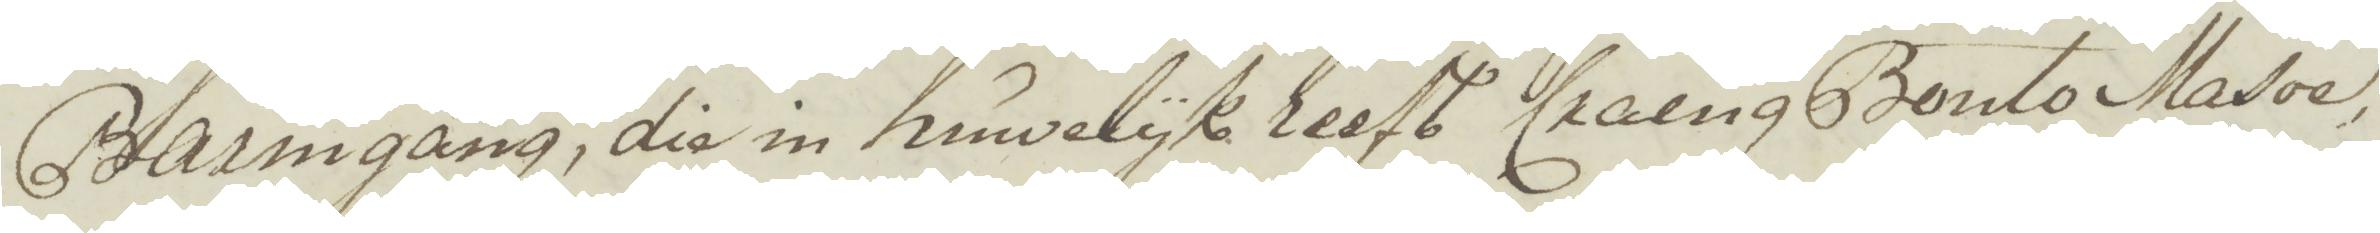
Baringang, die in huwelijk heeft Craeng Bonto Masoe„
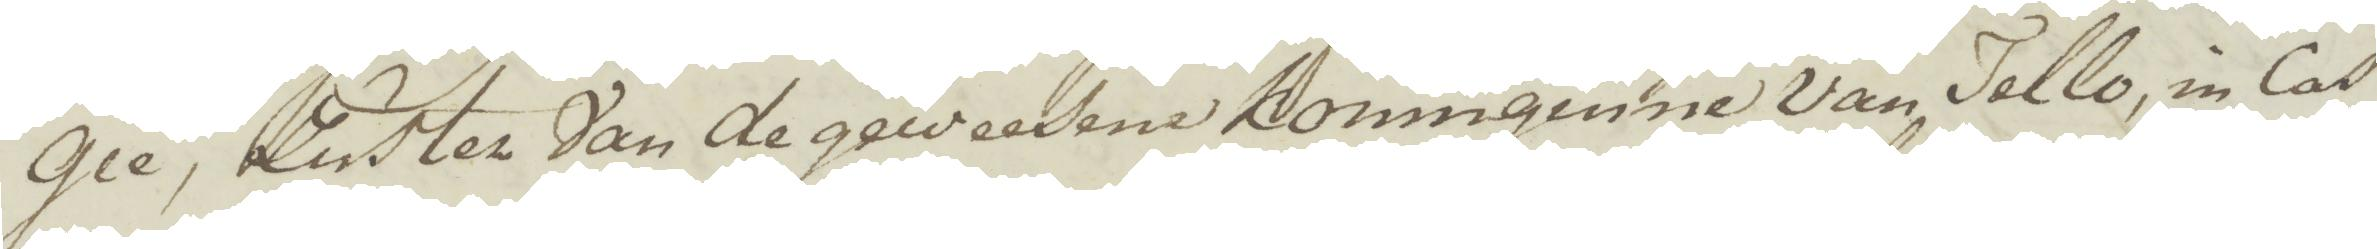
gie, zuster van de geweesene koninginne van Tello, in Cas
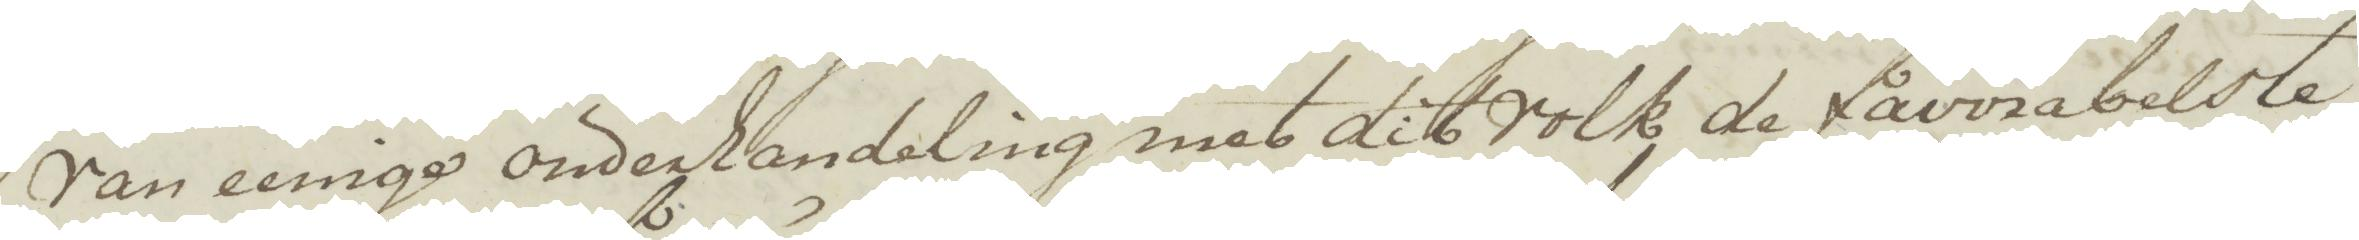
van eenige onderhandeling met dit volk de favorabelste
